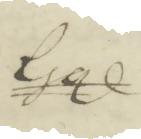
Gql
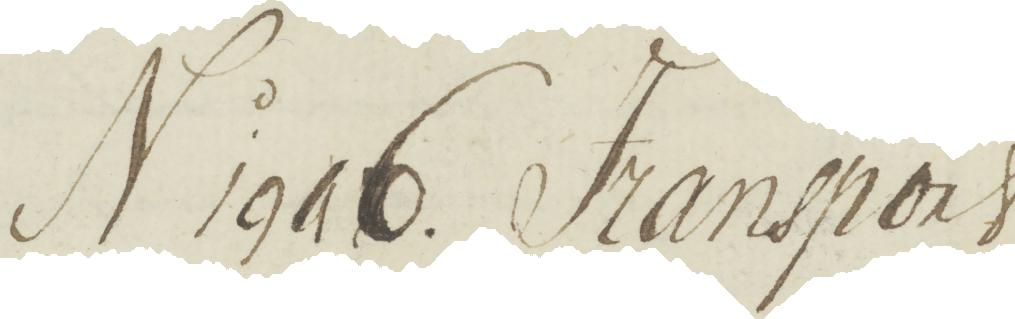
N.o 1946. Transport.
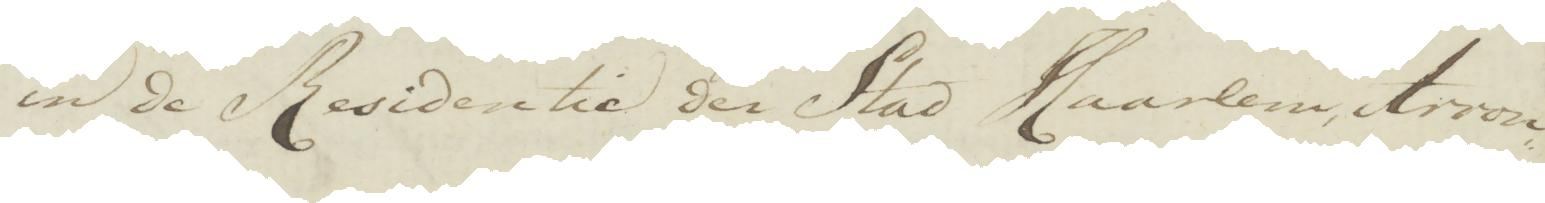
in de Residentie der Stad Haarlem, Arron„
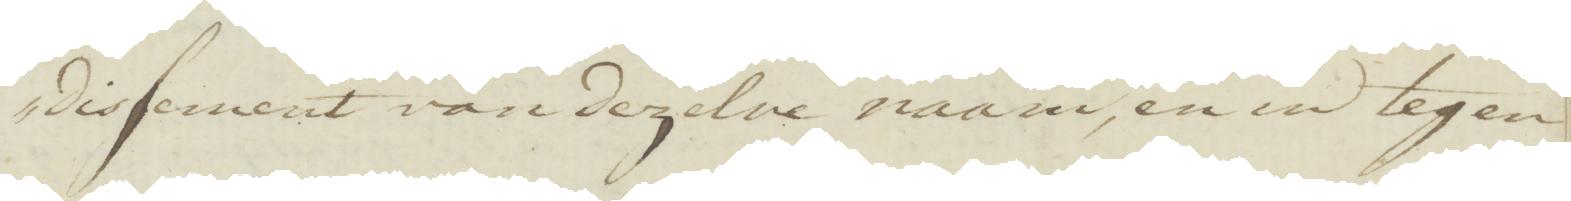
„dissement van dezelve naam, en in tegen
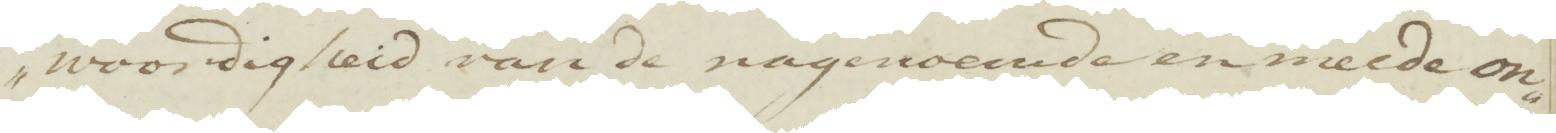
„woordigheid van de nagenoemde en meede on„
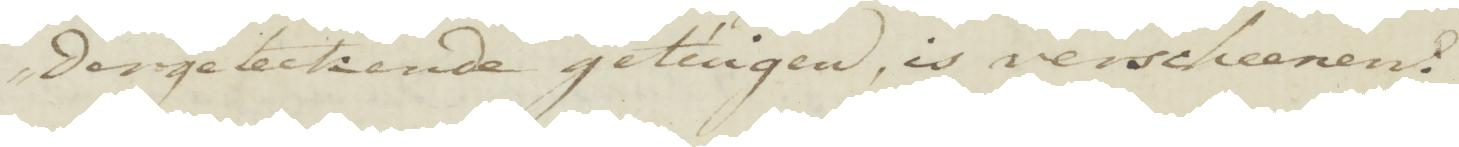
„dergeteekende getuigen, is verscheenen:
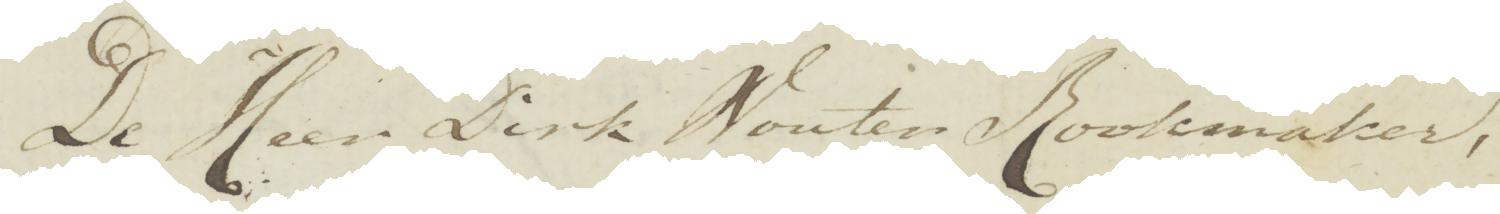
De Heer Dirk Wouter Rookmaker,
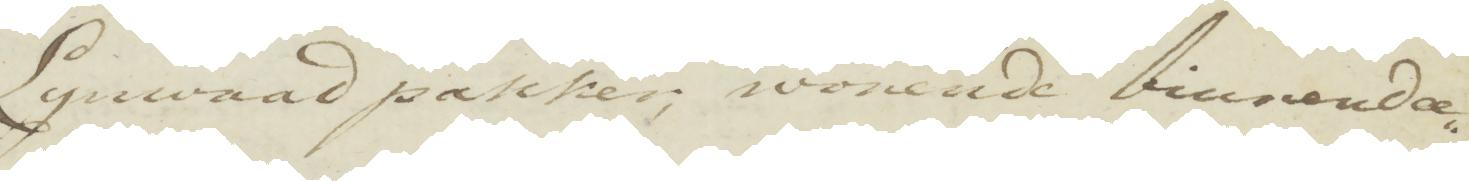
Lynwaad pakker, wonende binnen dee„
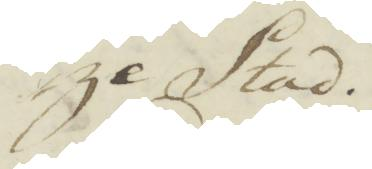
„ze stad.
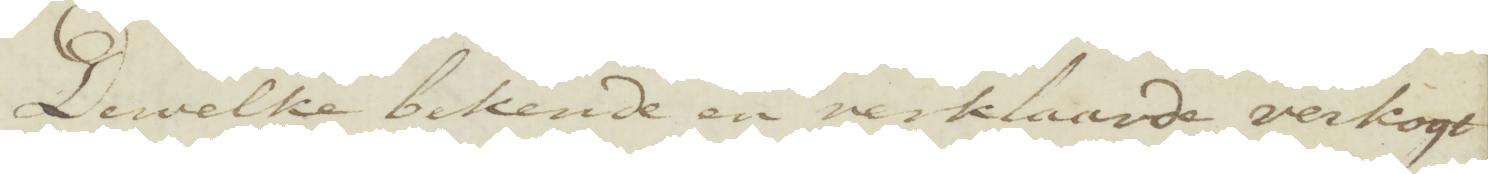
Dewelke bekende en verklaarde verkogt
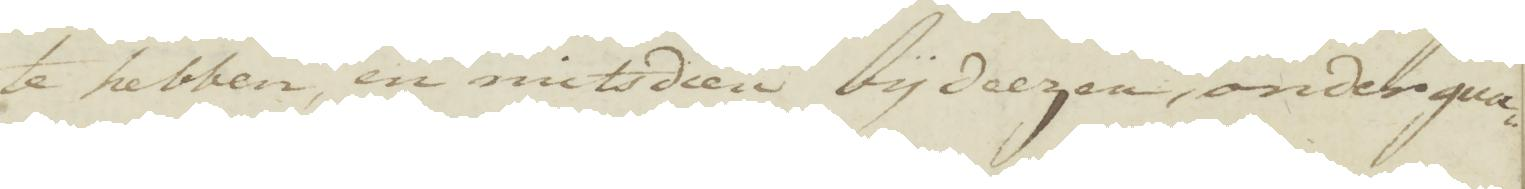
te hebben, en mitsdien bij deezen, onder qua„
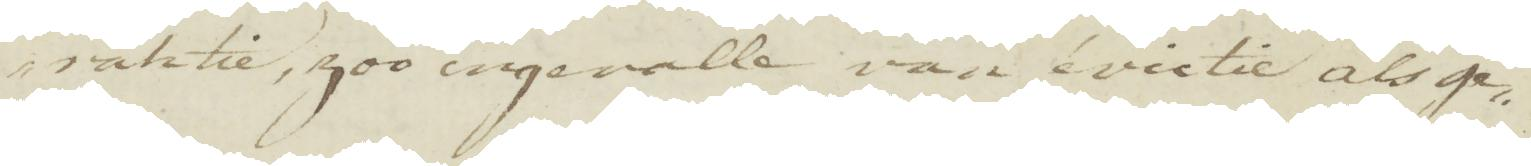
„raktie, zoo ingevalle van évictie als ge„
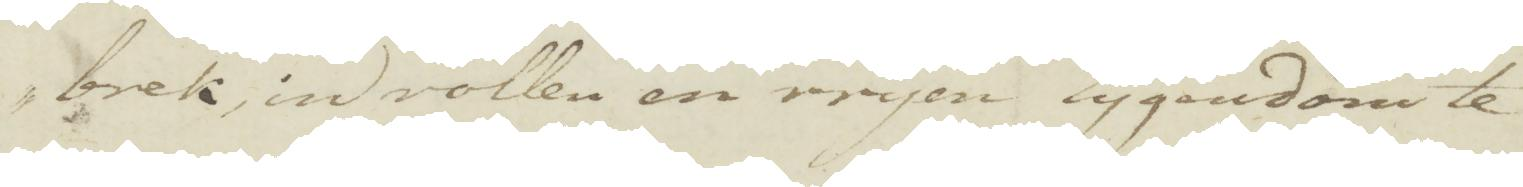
„brek, in vollen en vrijen Eijgendom te
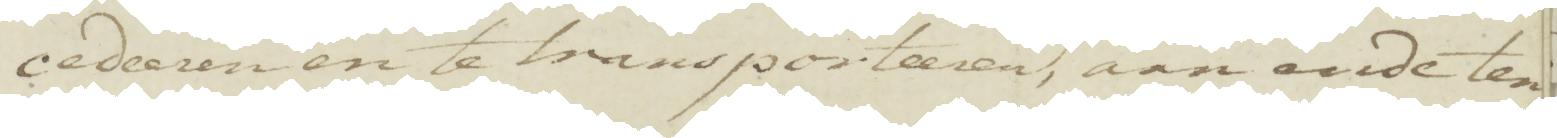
cedeeren en te transporteeren, aan ende ten
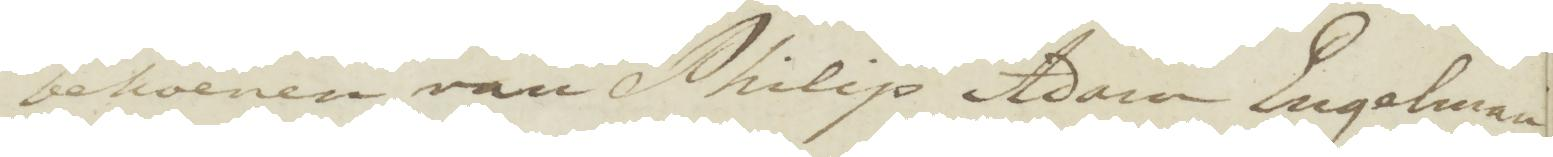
behoeven van Philip Adam Engelman
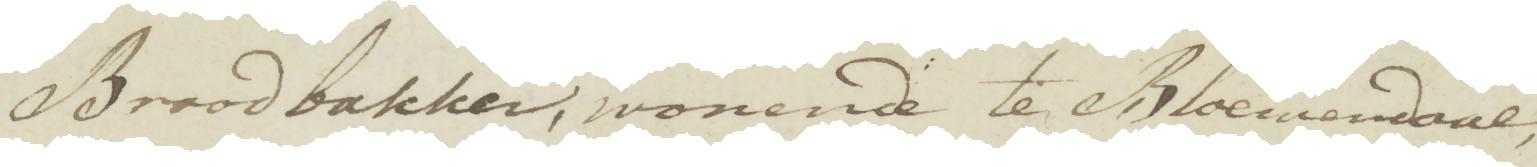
Broodbakker, wonende te Bloemendaal,
